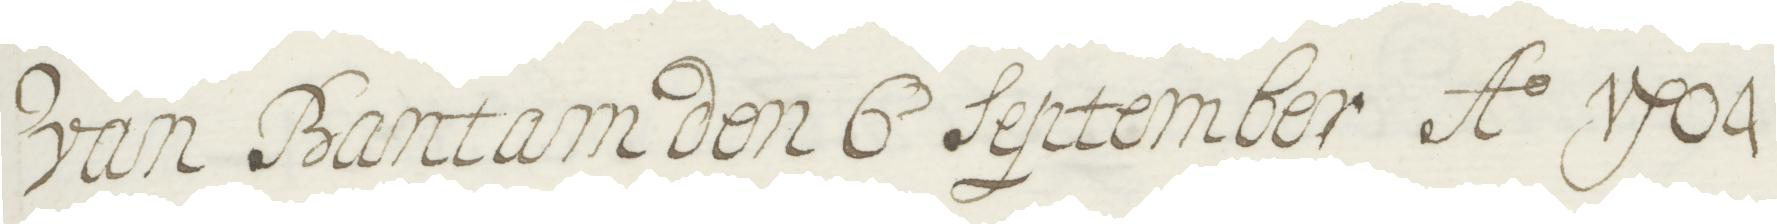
Van Bantam den 6 September Ao 1704
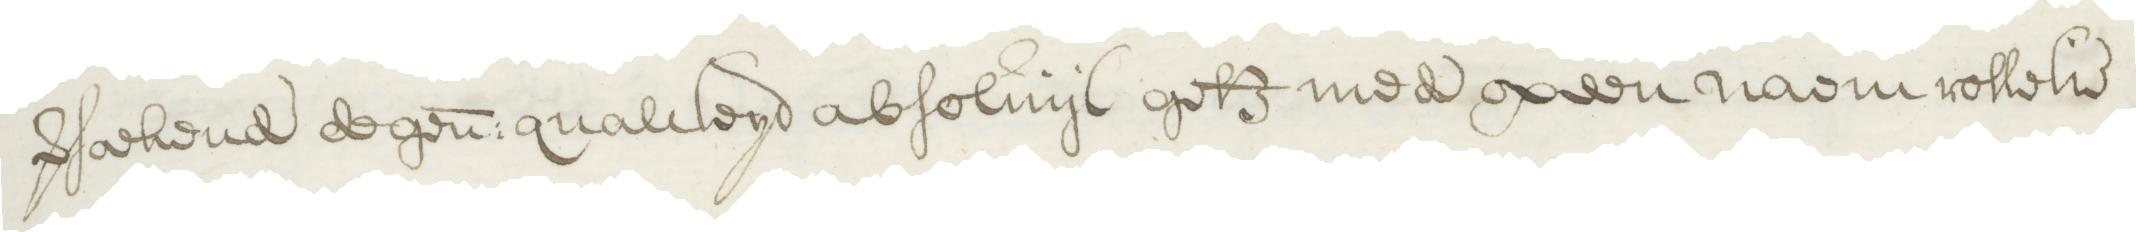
versoekende de gen: qualiteyd absoluijt gelijk mede op een naem rolletie
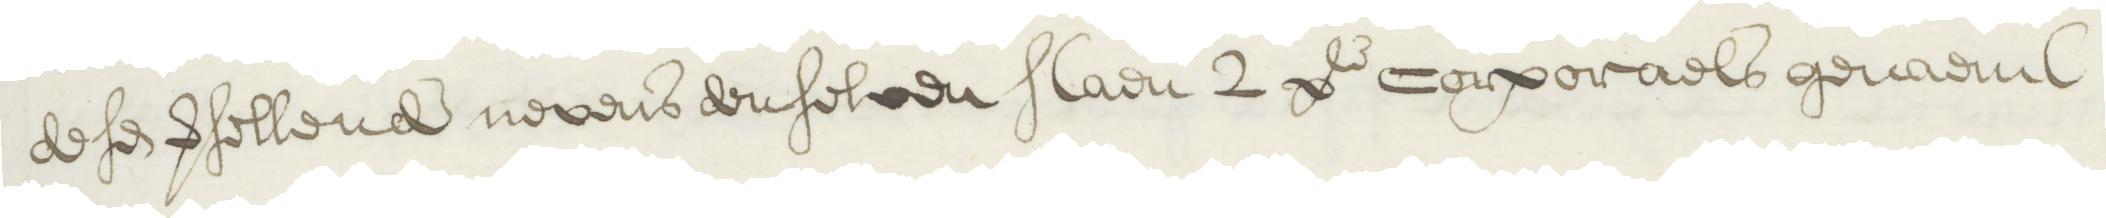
desen versellende nevens denselven staen 2 ple corporaels genaemt
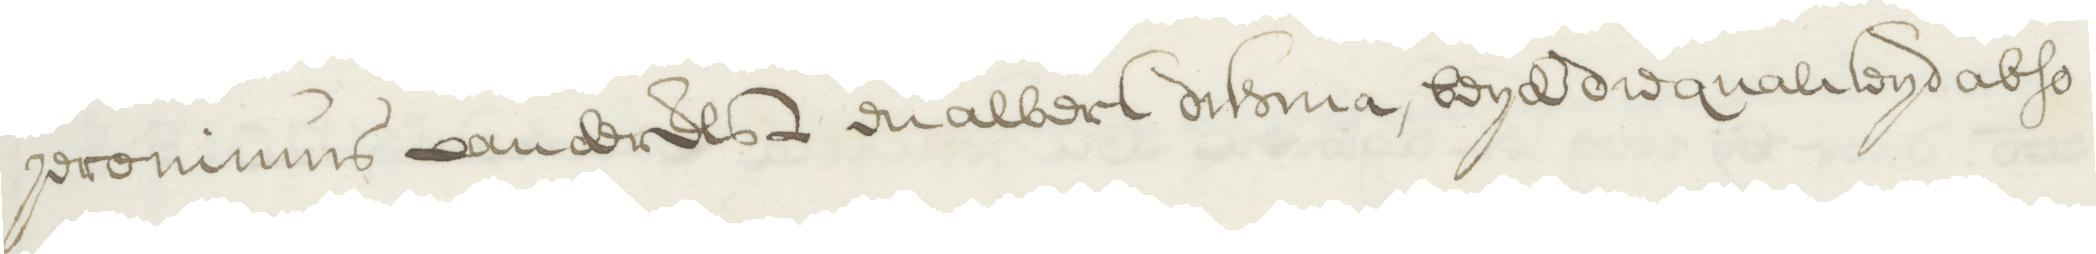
jeronimus van der Elst en albert ditsma, beyde die qualiteyd abso
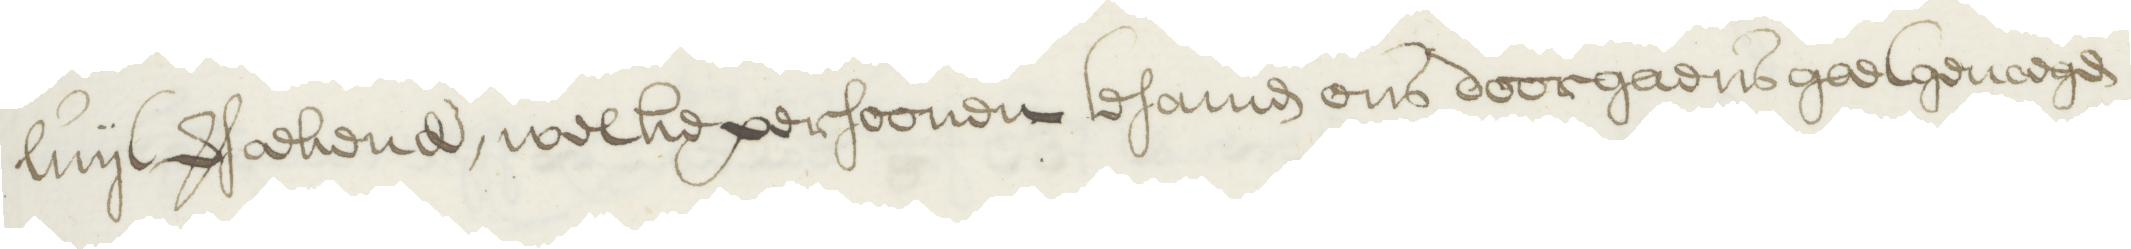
luijt versoekende, welke persoonen te samen ons doorgaens goetgenoegen
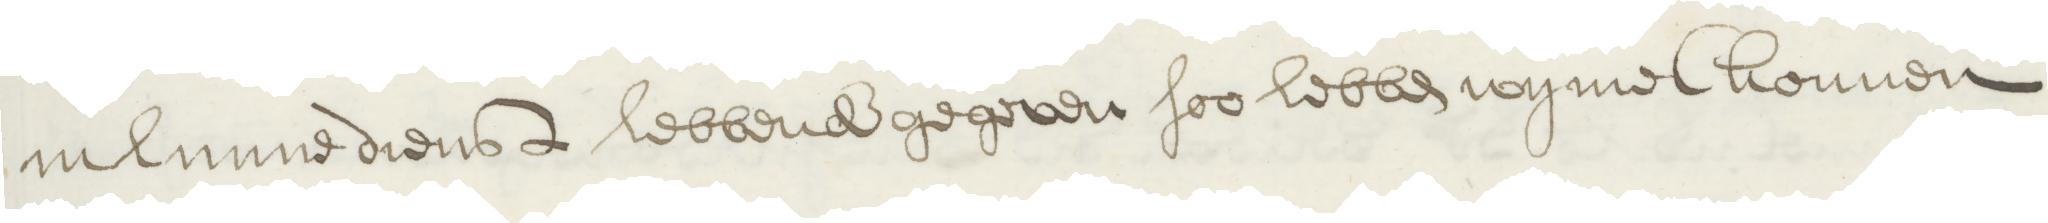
in hunne dienst hebbende gegeven soo hebben wy niet konnen
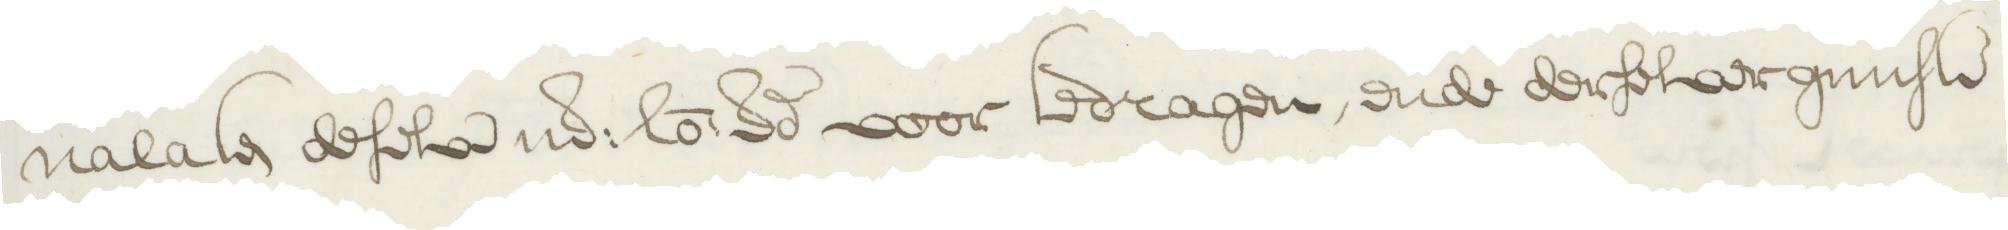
nalaten deselve uE: ho: Ed voor tedragen, ende derselver gunste
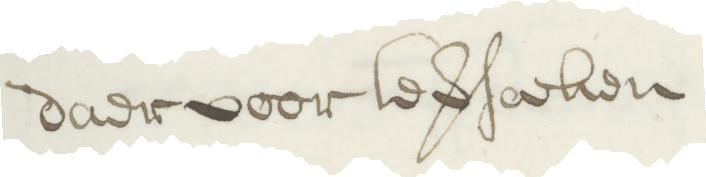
daer voor te versoeken
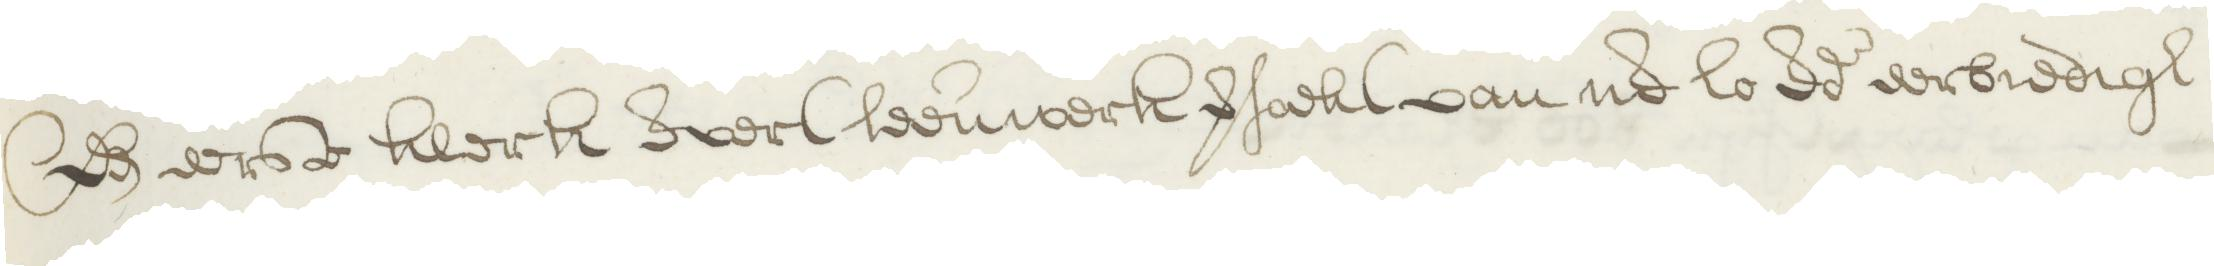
Den eerste klerk Evert leeuwerk versoekt van uE ho Ed eerbiedigh
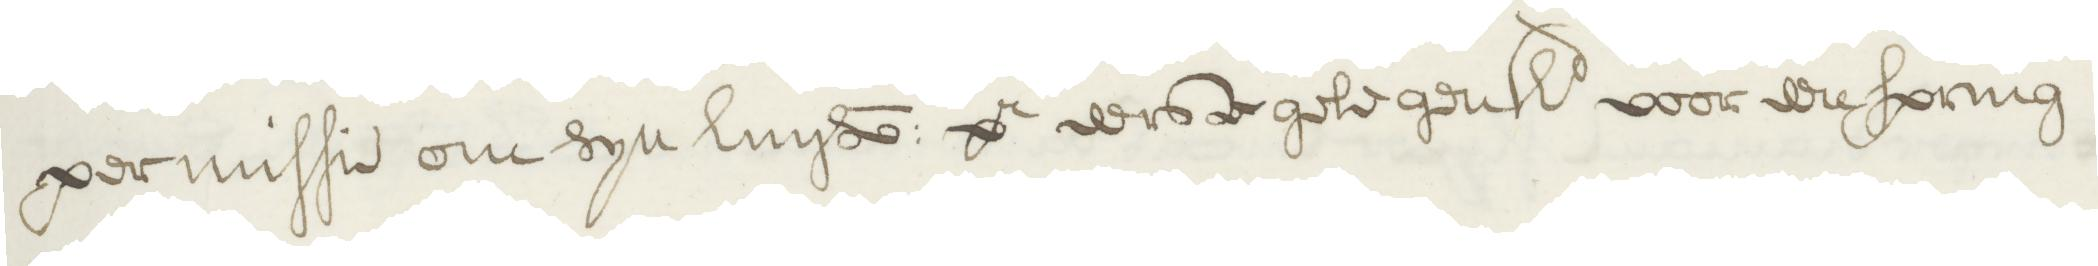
permissie om syn huysv: pr eerste gelegenth:d voor een spring
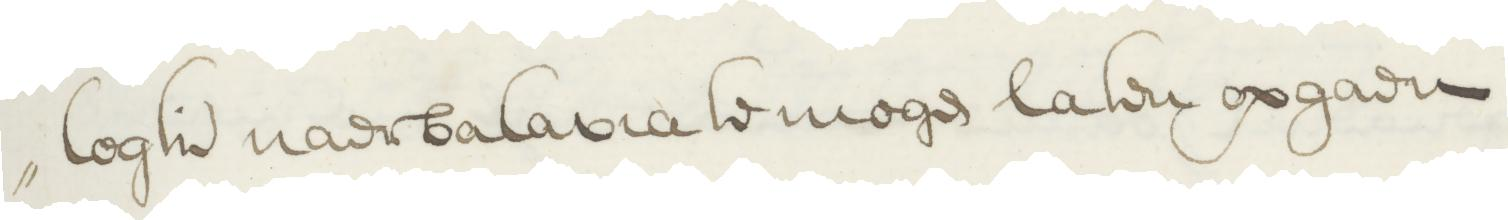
„logtie naer batavia te mogen laten opgaen
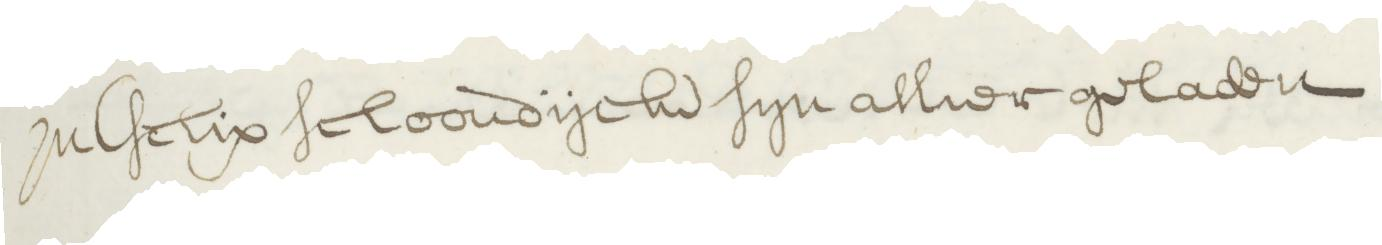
jn tschip schoondijcke syn alhier geladen
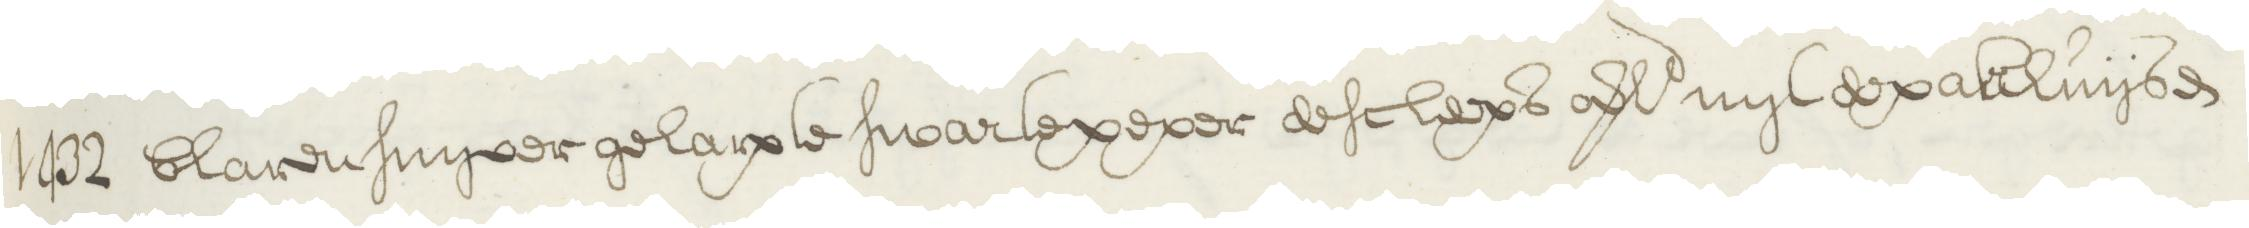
1432 blaren suyver geharpte swarte peper de scheps overhd uyt de pakhuijsen
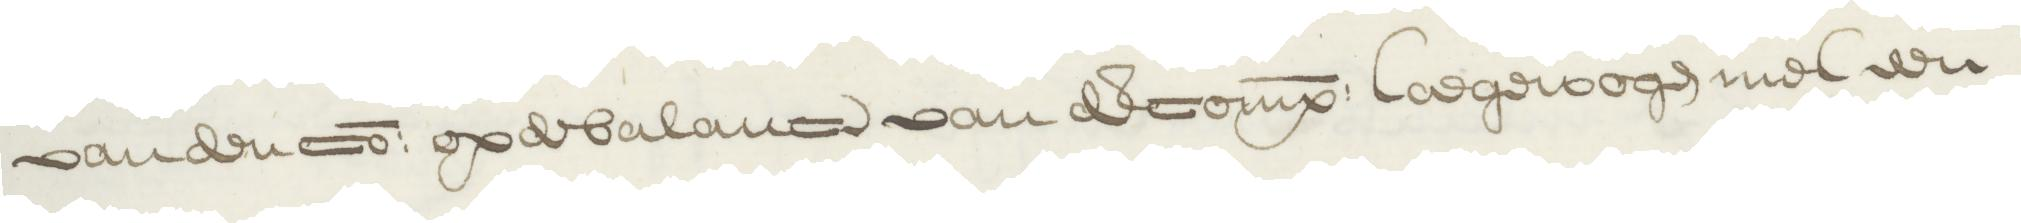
van den co: op de balance van de comp: toegewogen met een
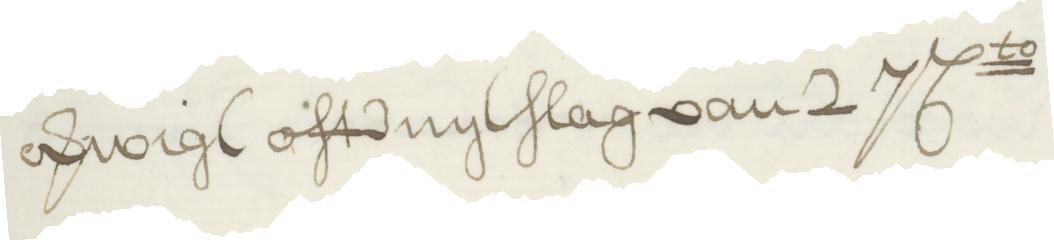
overwigt ofte uytslag van 2 pC=to
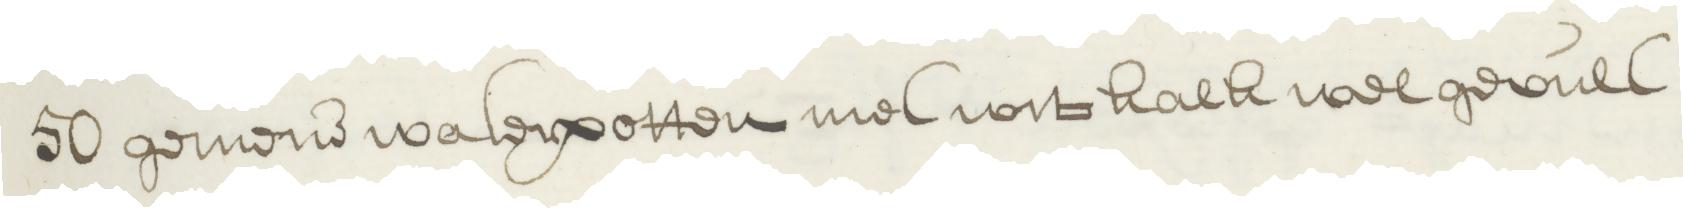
50 gemene waterpotten met wit kalk wel gevult
